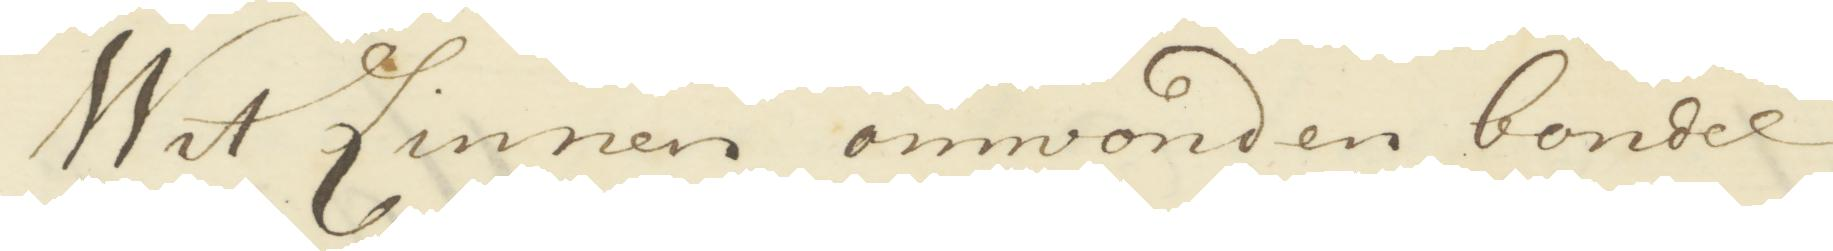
Wit Linnen omwonden bondel
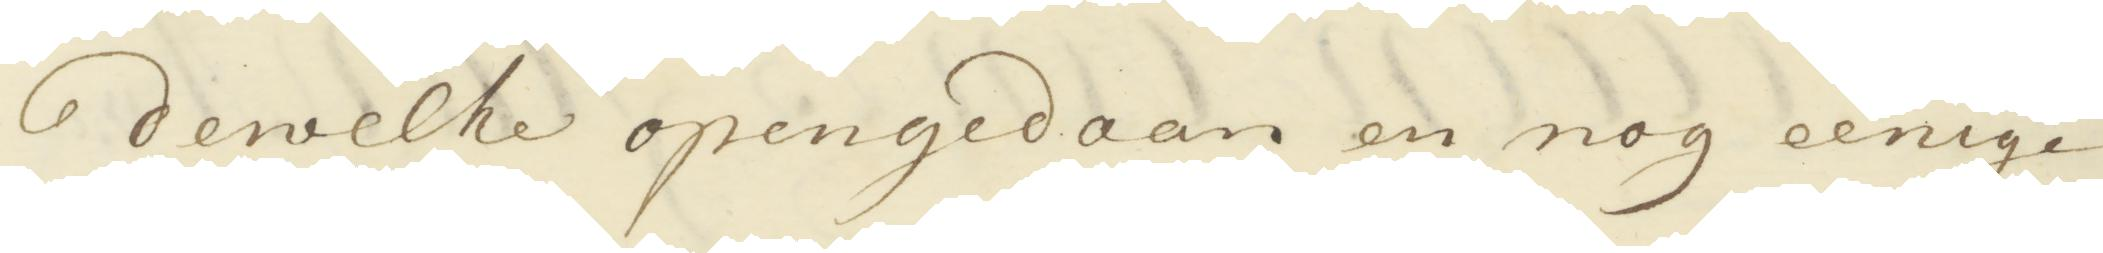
dewelke open gedaan, en nog eenige
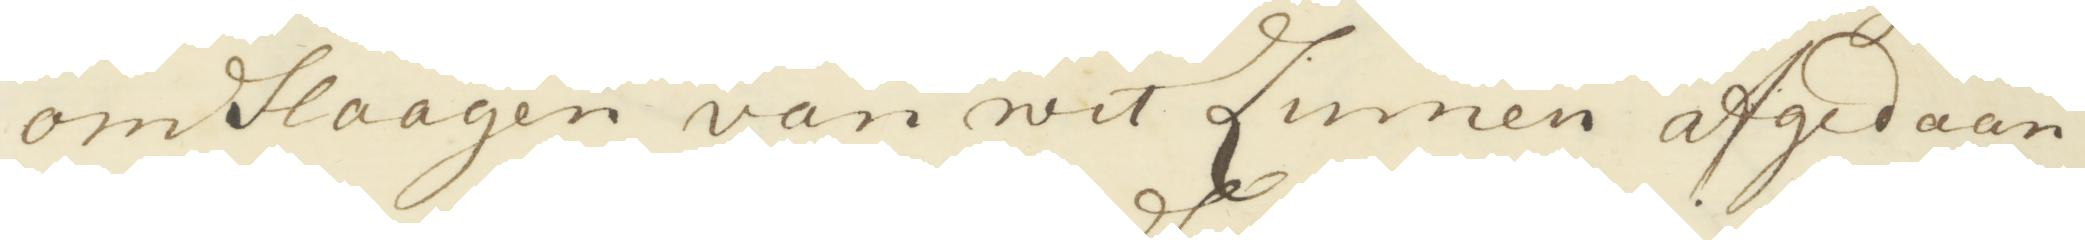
omslaagen van wit Linnen afgedaan
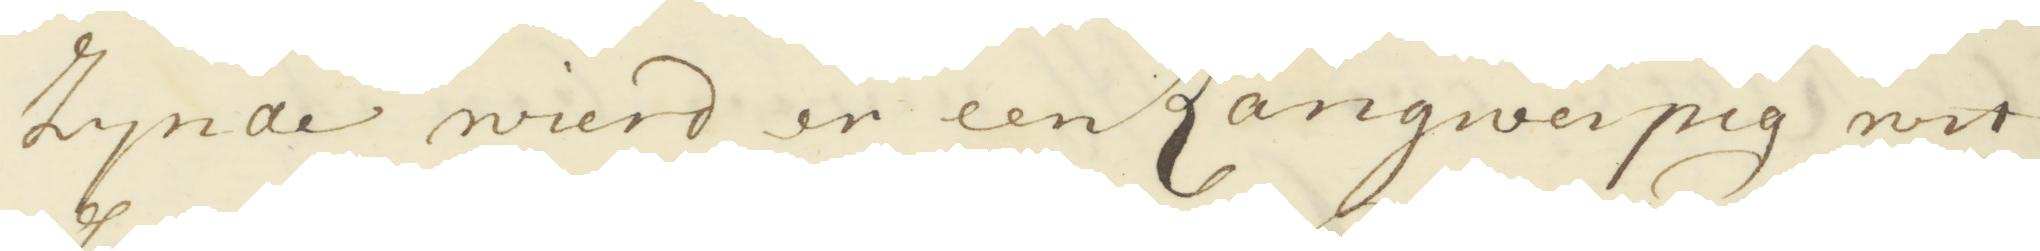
zynde wierd er een Langwerpig wit
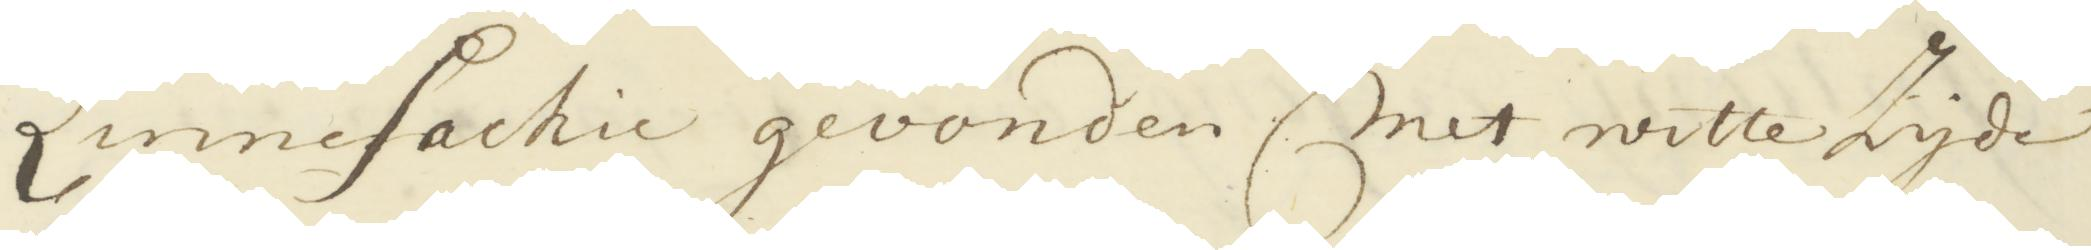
Linnesackie gevonden met witte zijde
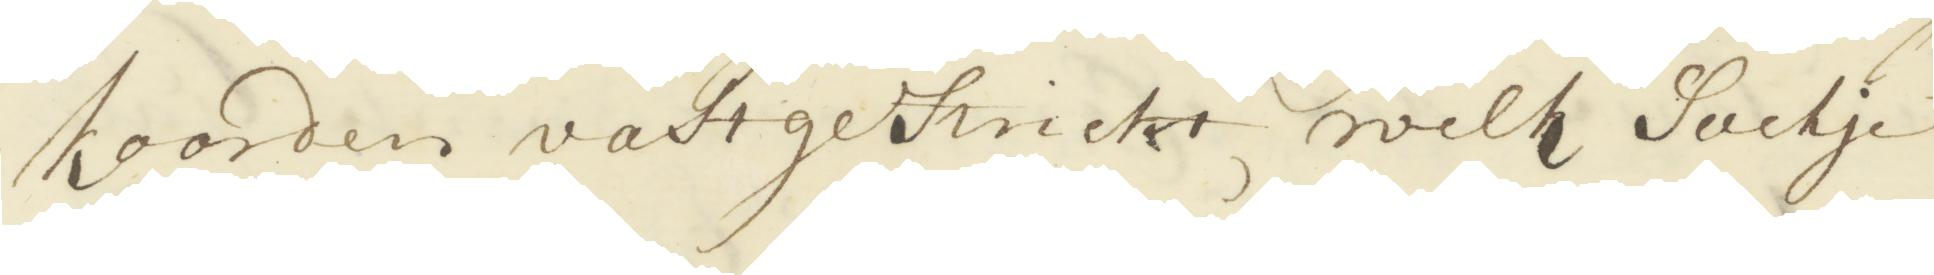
koorden vastgestrickt welk sackje
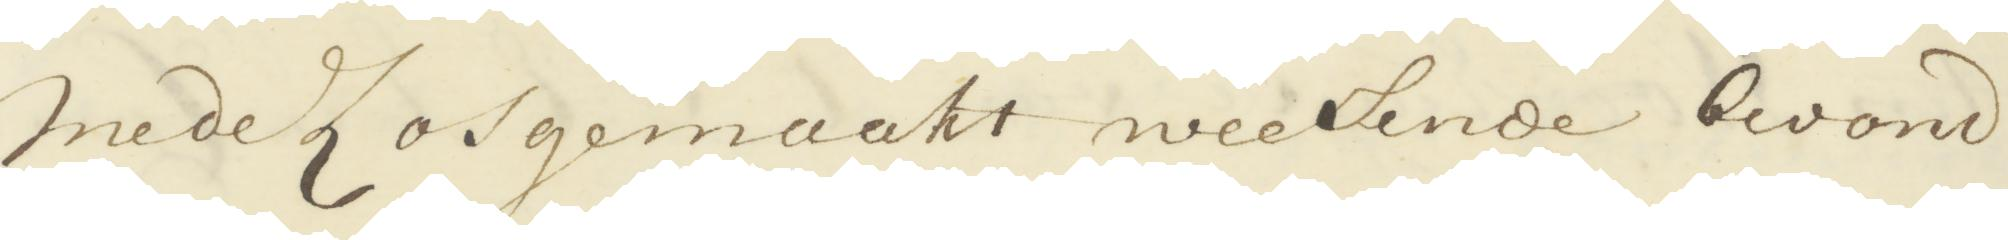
mede Losgemaakt weesende bevond
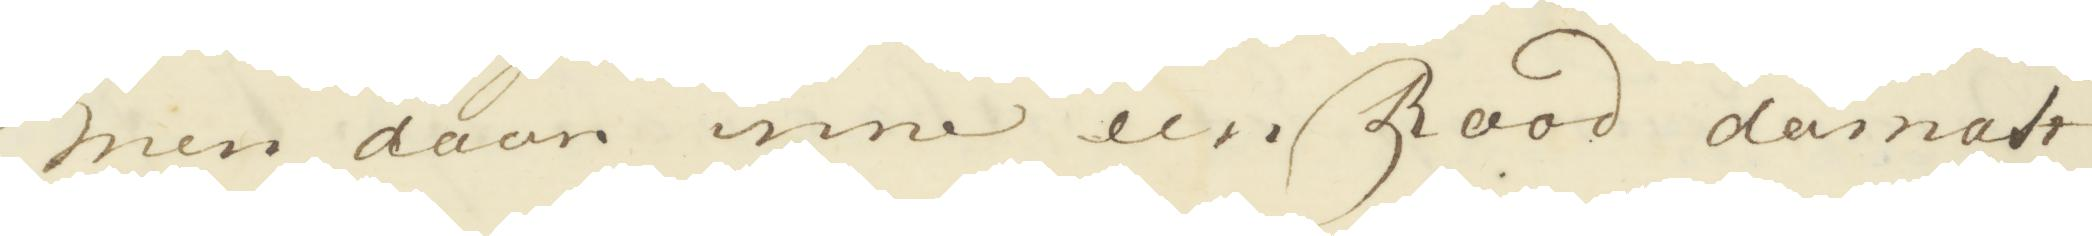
men daar inne een Rood damast
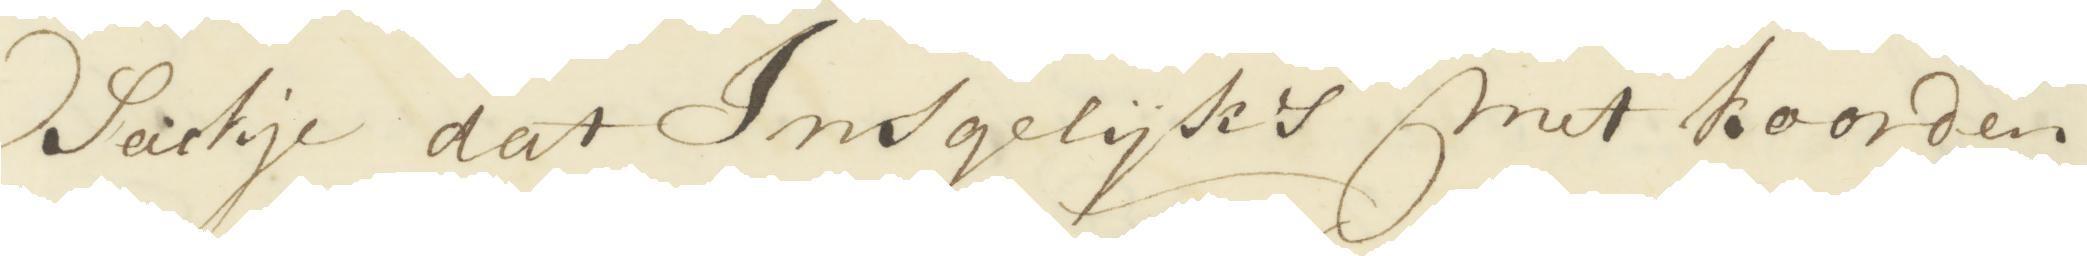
Sackje dat Insgelijks met koorden
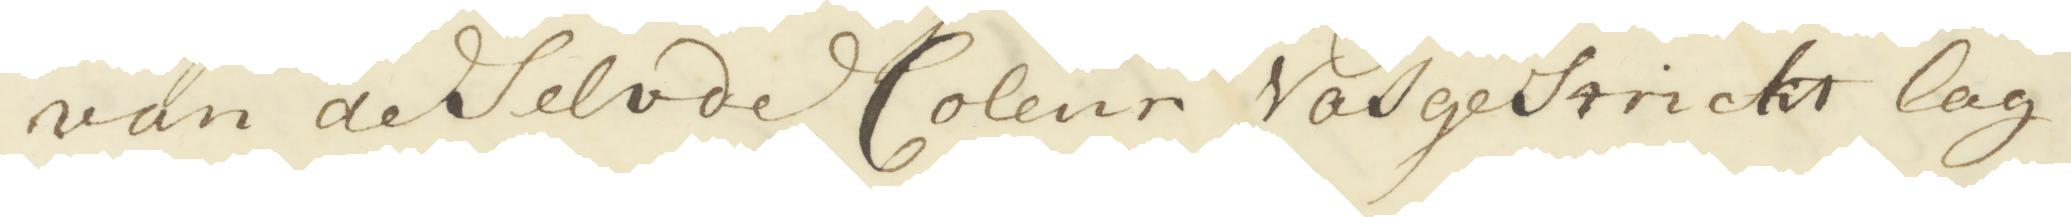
van deselvde Coleur Vasgestrickt lag
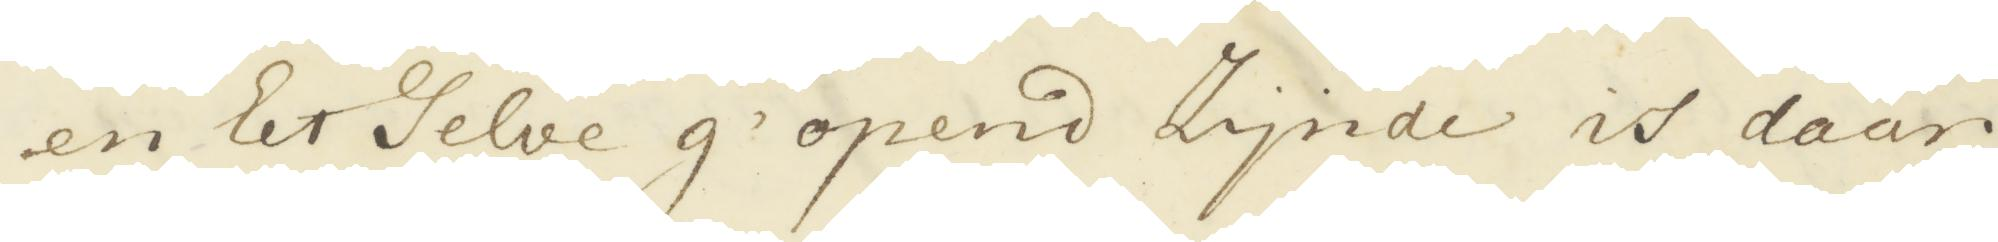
en het selve g’opend zijnde is daar
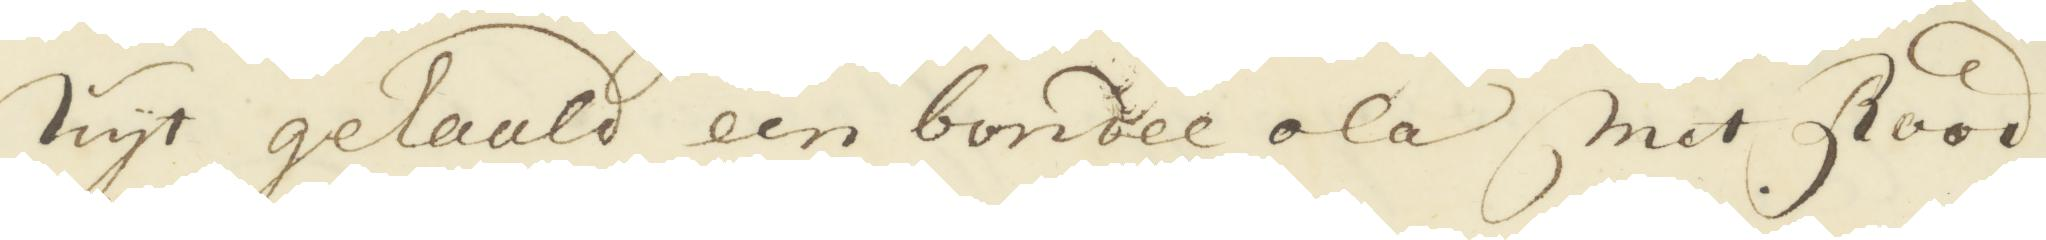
uijt gehaald een bondel ola met Rood
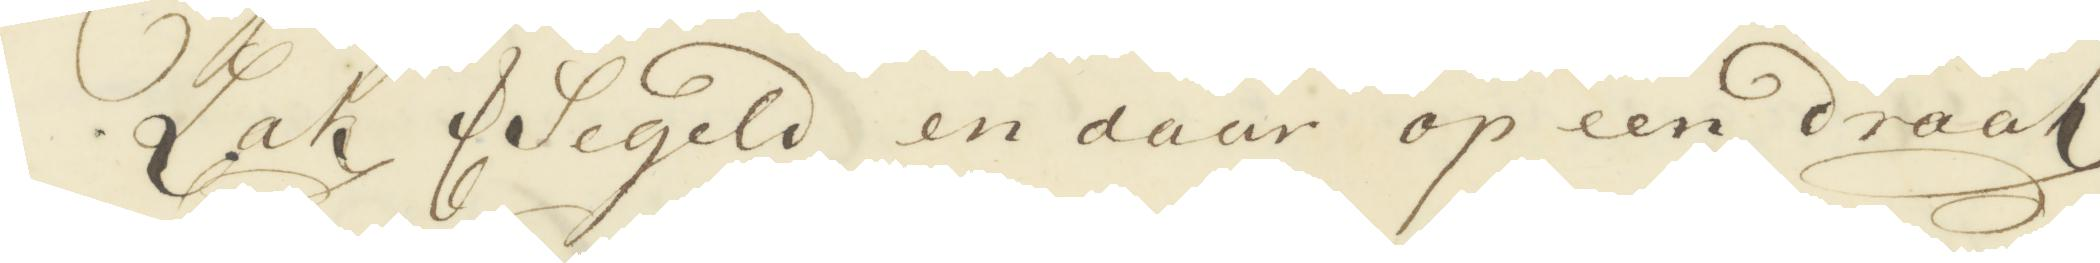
Lak versegeld en daar op een draak
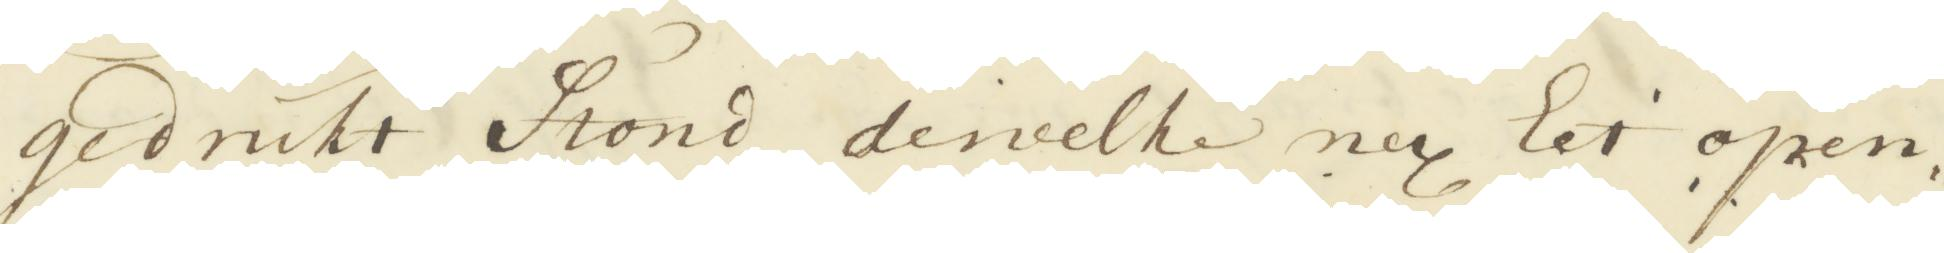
gedrukt stond dewelke na het open„
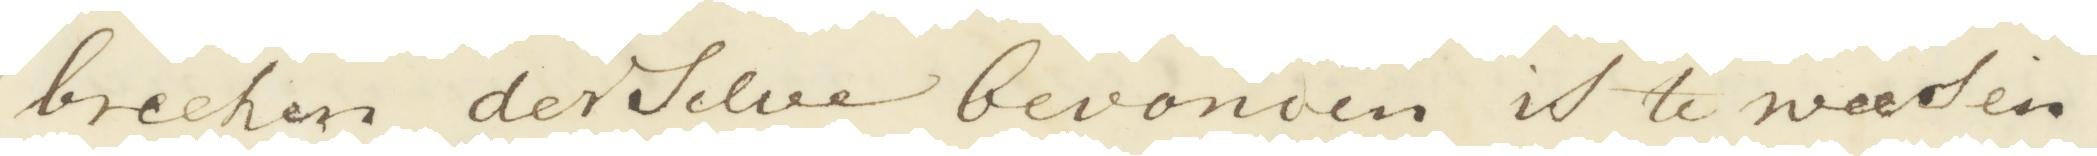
breeken derselve bevonden is te weesen
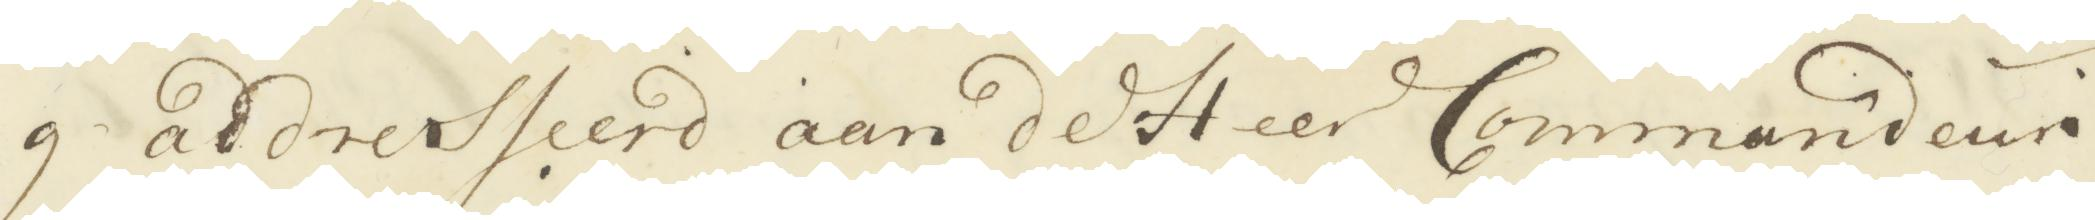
g’addresseerd aan de Heer Commandeur
